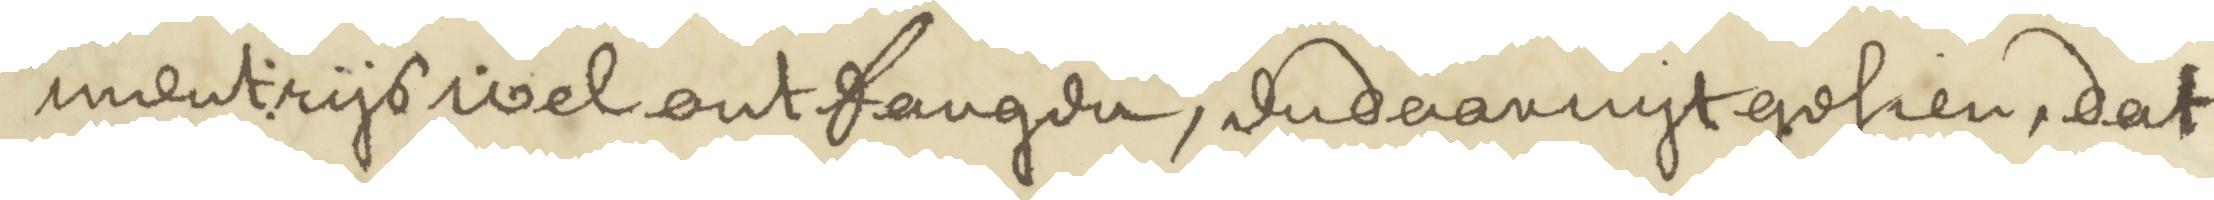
inentrijs wel ont fangen, en daaruijt gesien, dat
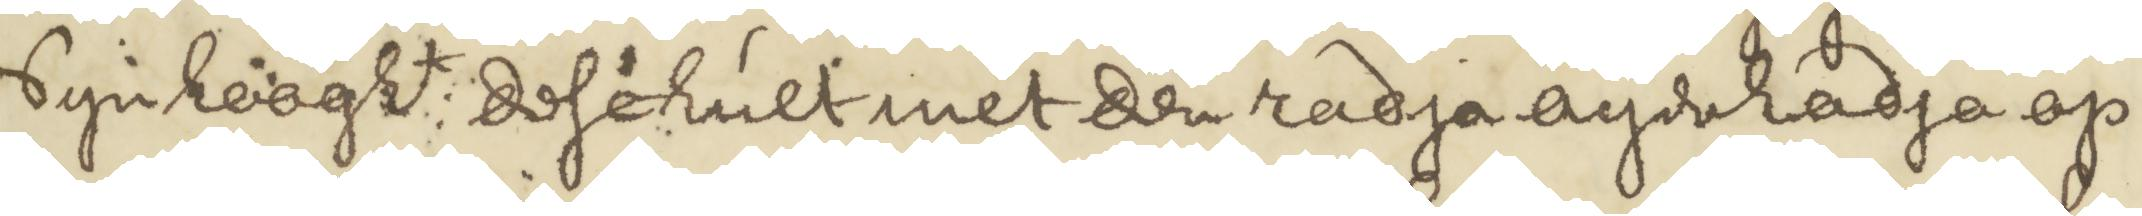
sijn hoogh:t deschult met den radja ayerhadja op
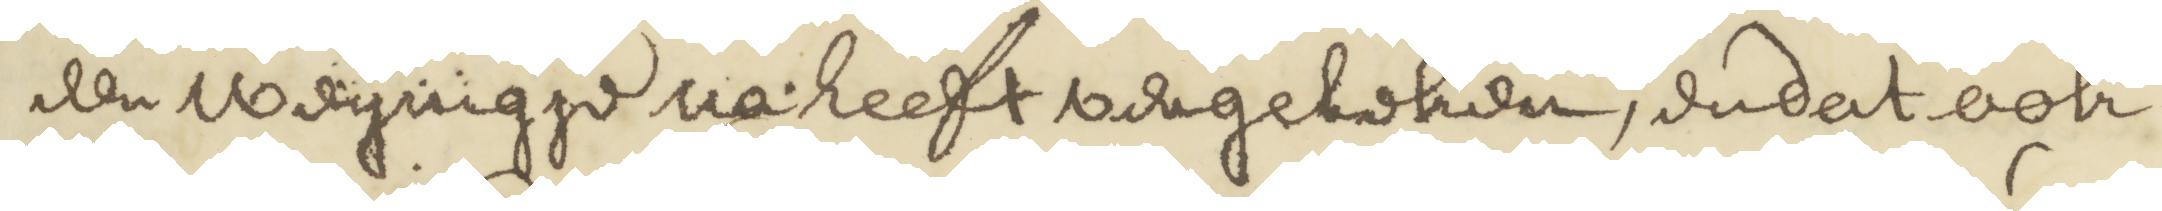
een weijnigje na heeft vergeleken , endat ook
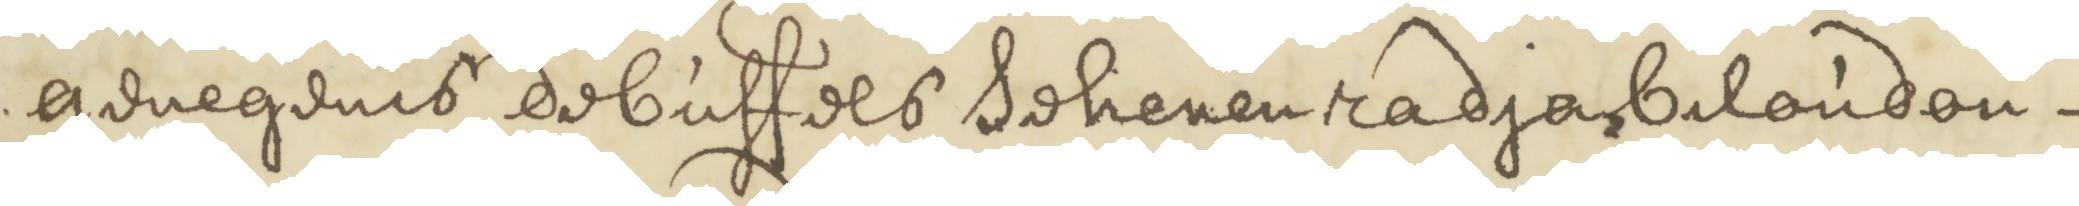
genegenis debuffels sekeren radja biloudou
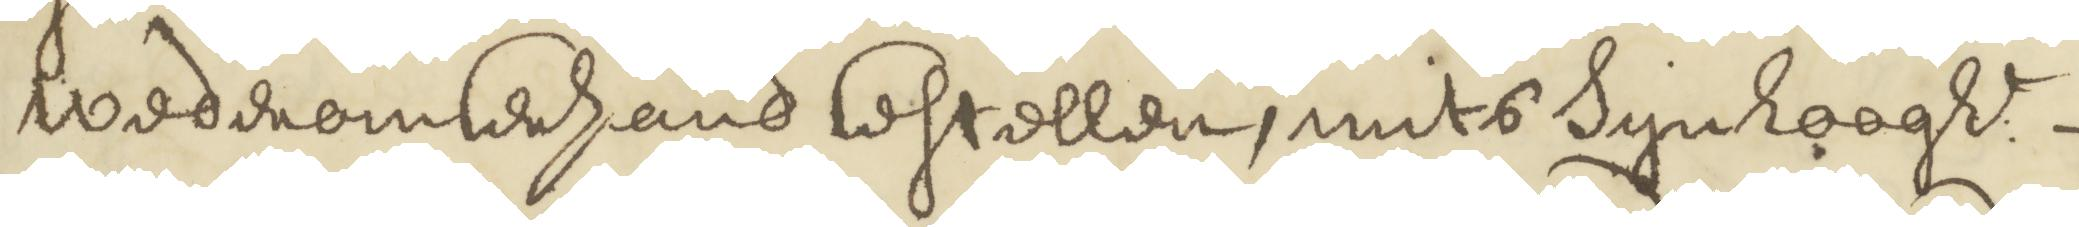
wederomterhand testellen, mits sijnhoogh:t
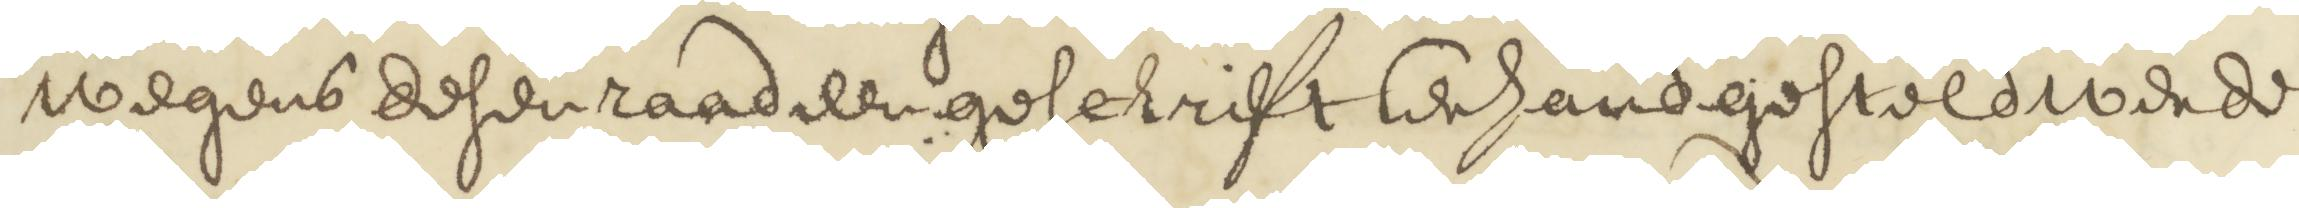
wegens desen raad een geschrift terhand gesteld werde
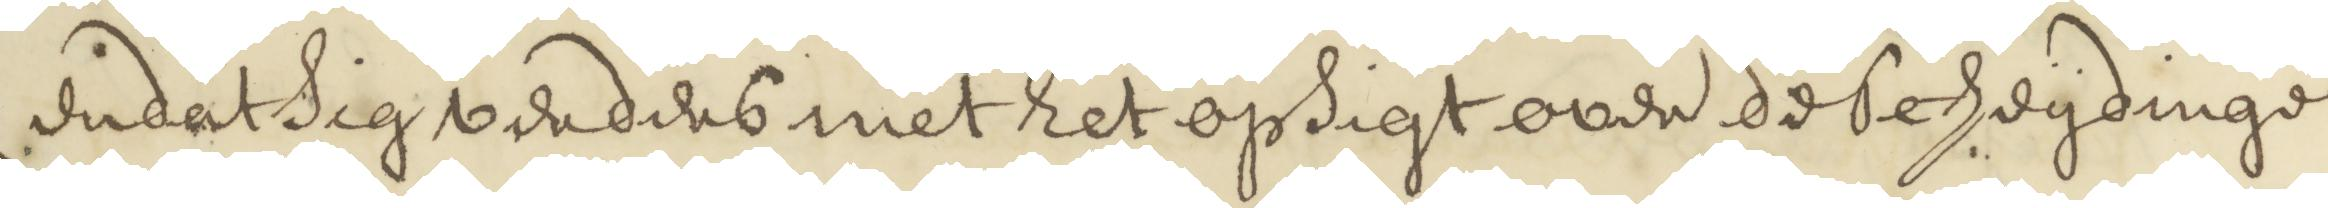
endat sig verders met het opsigt over de scheijdinge
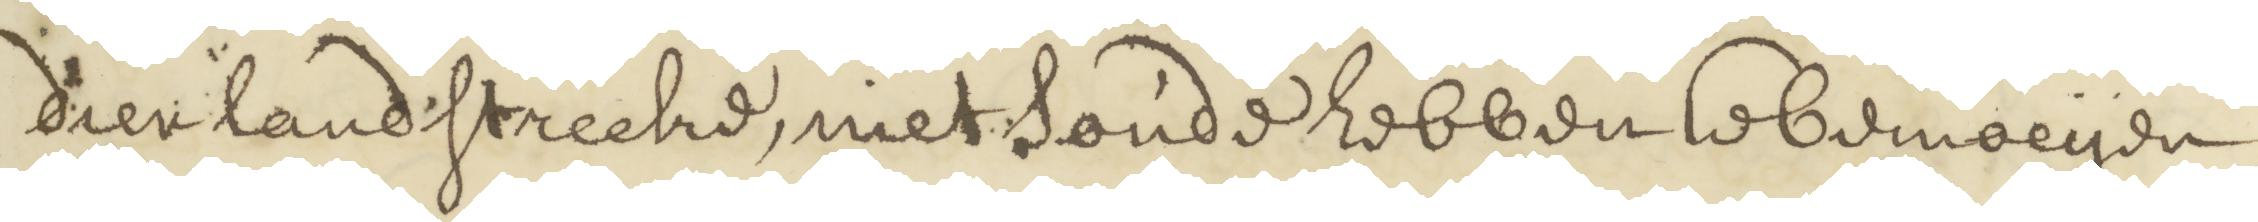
dier landstreeke, niet soude hebben te bemoeijen
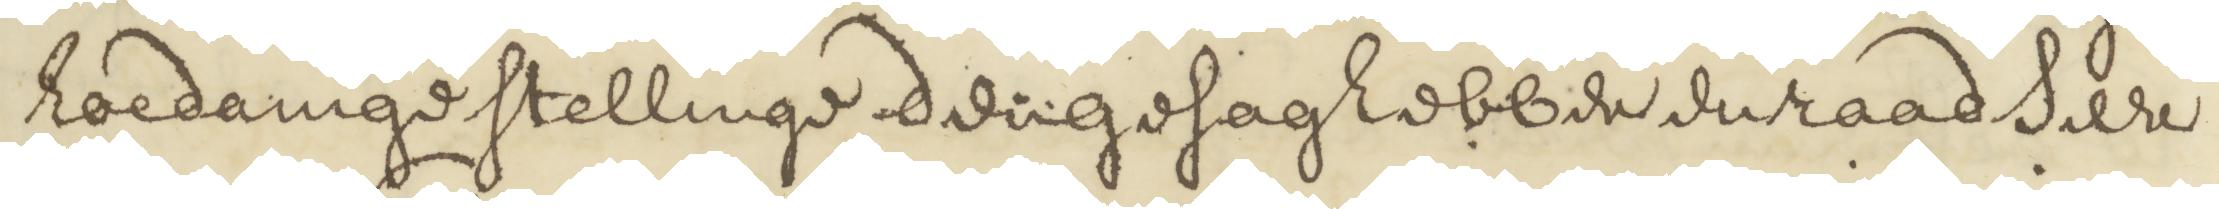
hoedanige stellinge dengesaghebber en raad seer
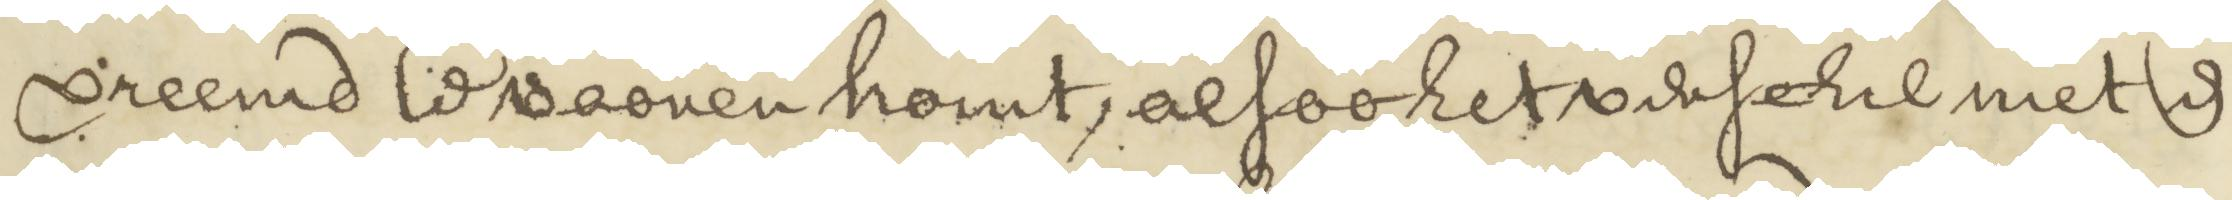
vreemd te vooren komt, alsoo het verschil niet en
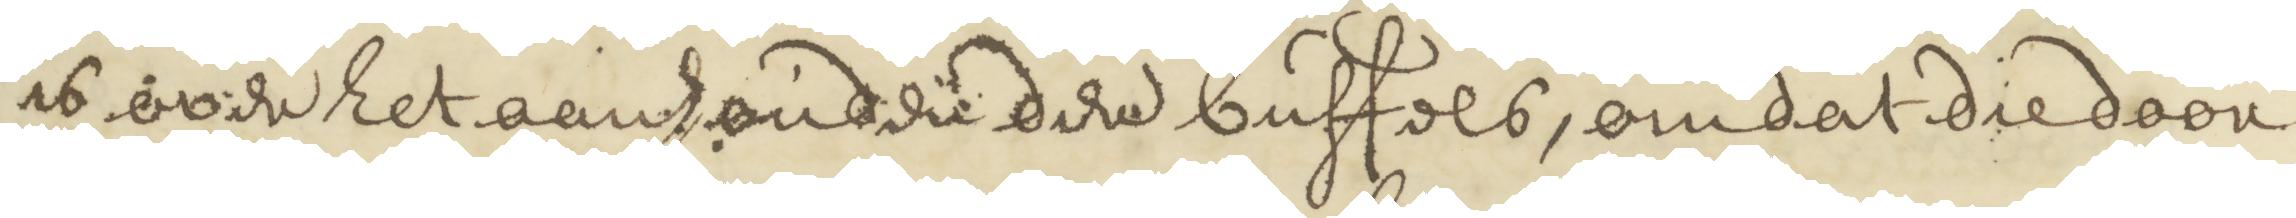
is over het aanhouden der buffels , om dat die door
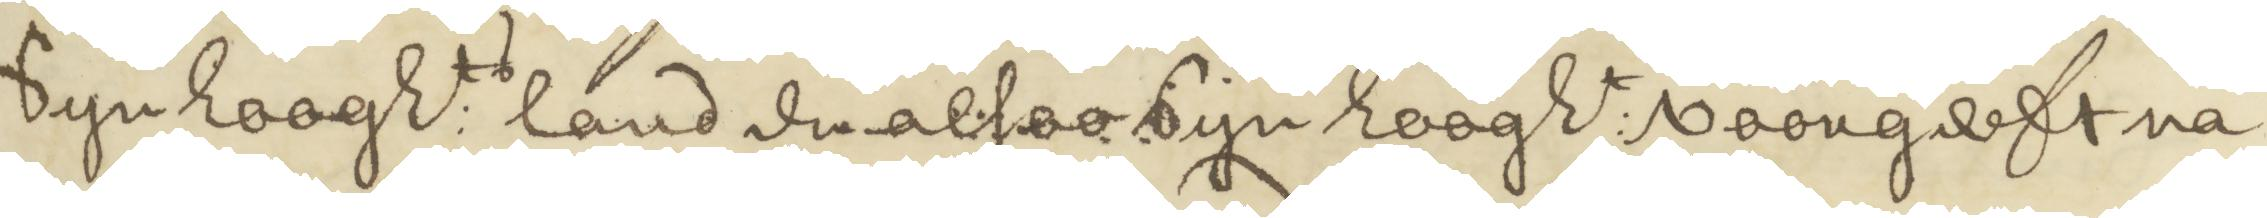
Sijn hoogh:ts land en alsoo sijn hoogh:t voorgeeft na
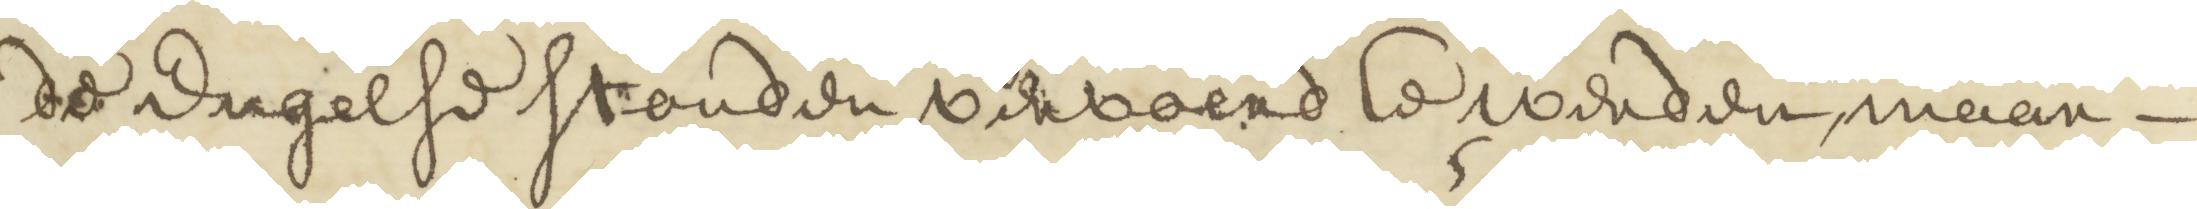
de Engelse stonden vervoerd te werden,maar—
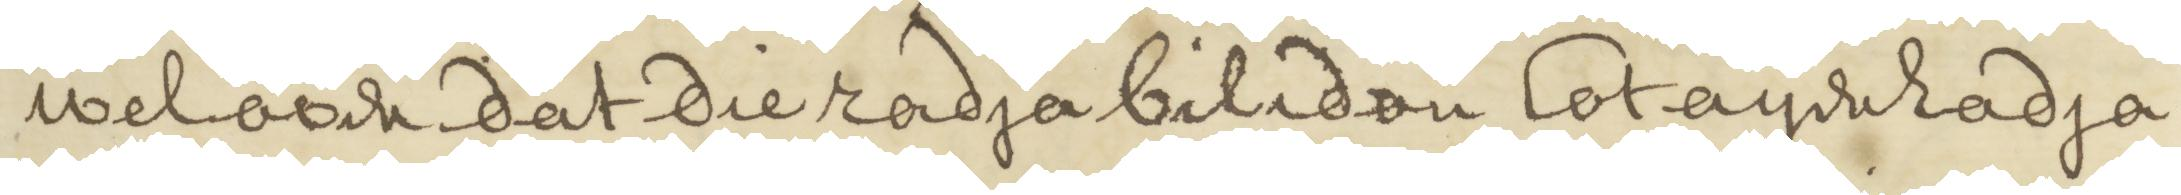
wel ook dat die radja bilidou tot ayerhadja
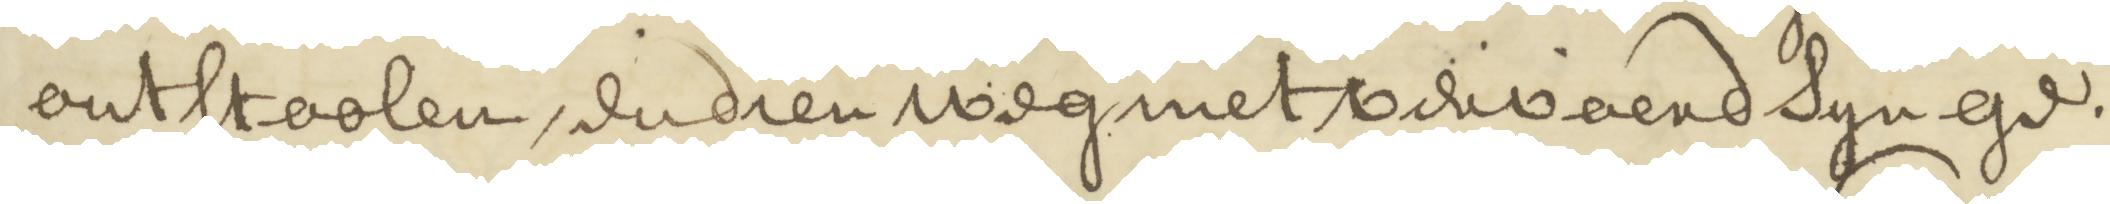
ontstoolen , en dien weg met vervoerd sijn ge.
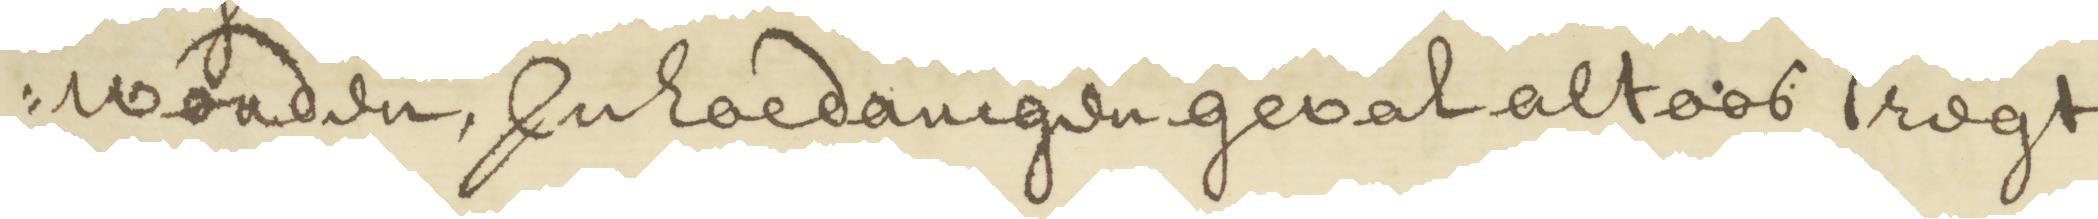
„worden, Inhoedanigen geval altoos tregt
